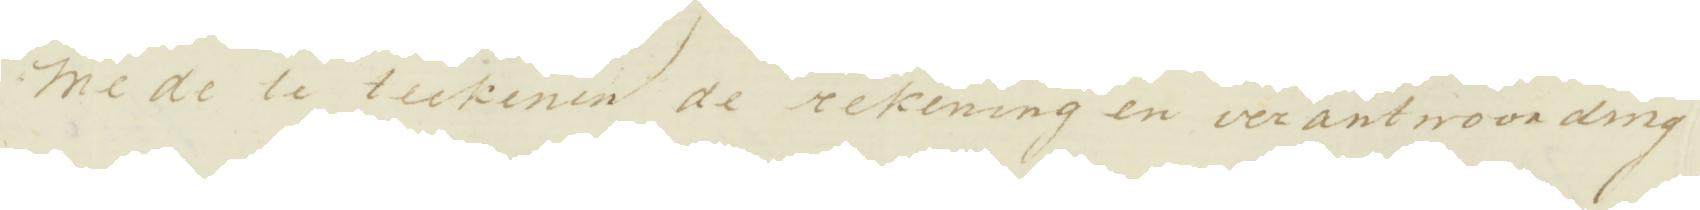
mede te teekenen de rekening en verantwoording
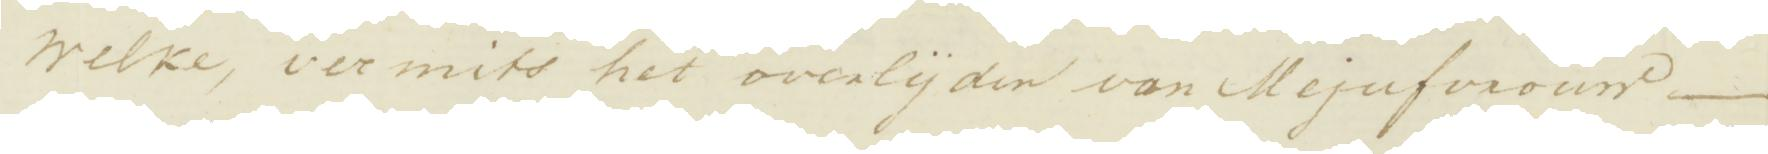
welke, vermits het overlijden van Mejufvrouw—
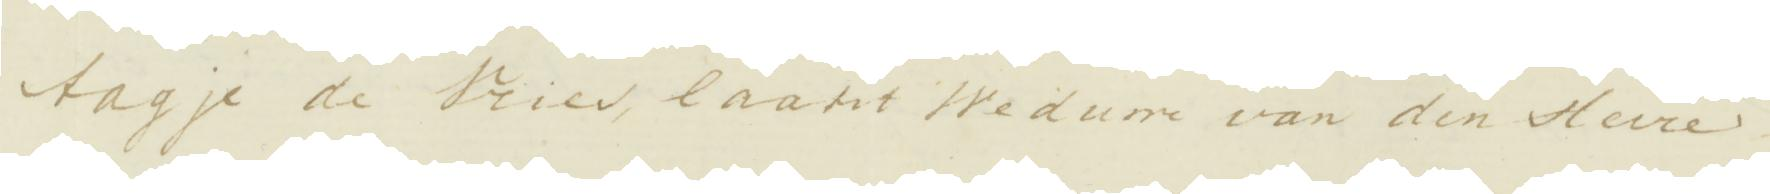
Aagje de Vries, laatst Weduwe van den Heere
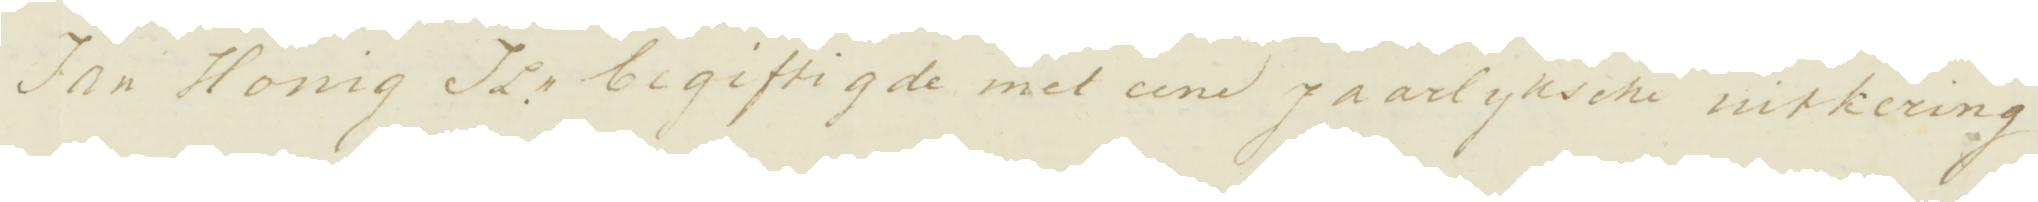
Ian Honig Il„ begiftigde met eene jaarlyksche uitkering
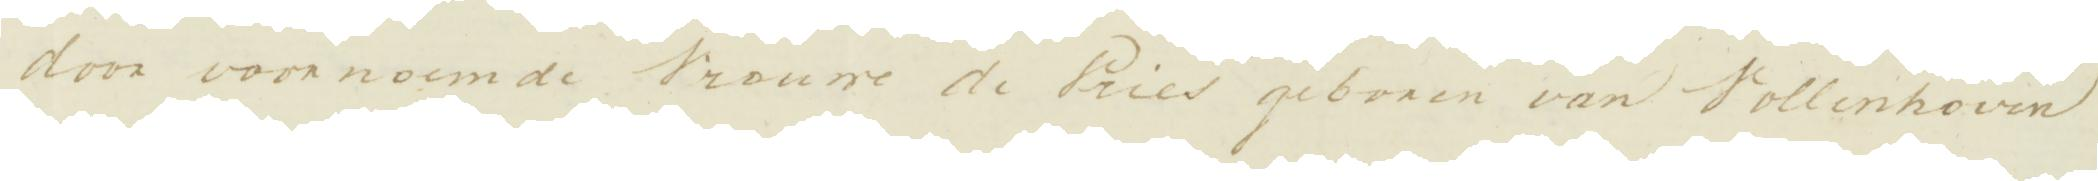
door voornoemde Vrouwe de Vries geboren van Vollenhoven
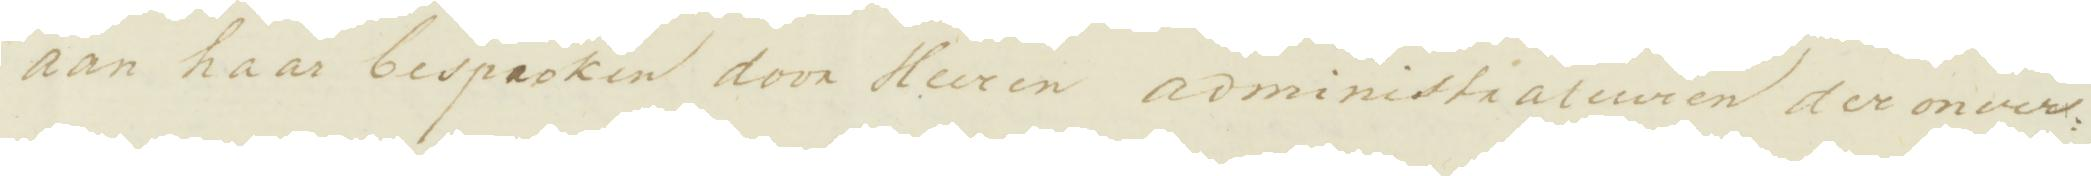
aan haar besproken door Heeren administrateuren der onver„
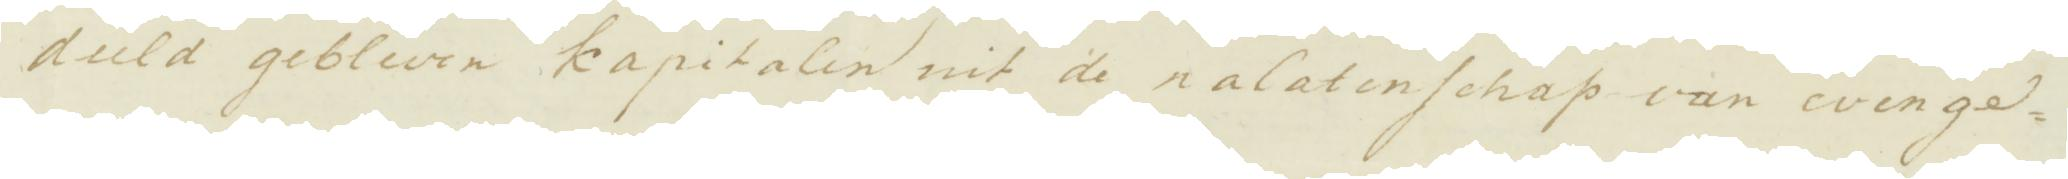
deeld gebleven kapitalen uit de nalatenschap van evenge=
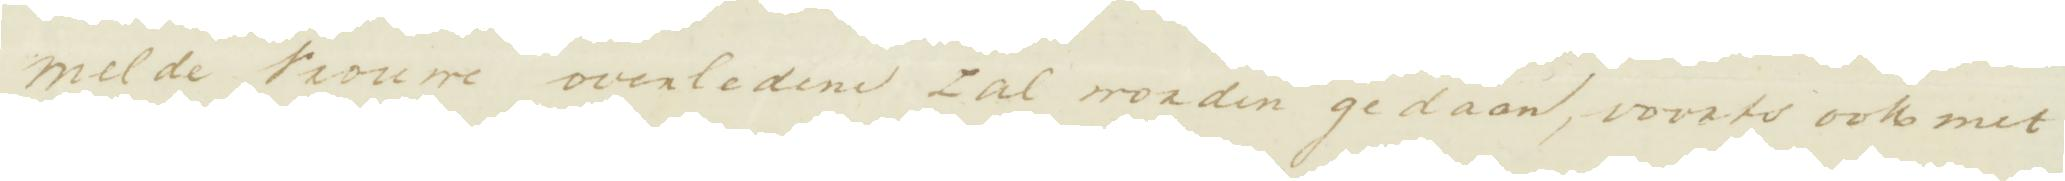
melde Vrouwe overledene zal worden gedaan, voorts ook met
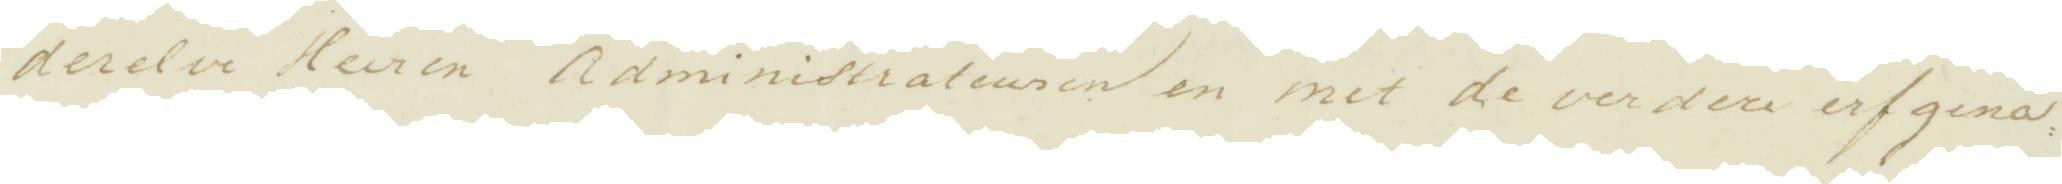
dezelve Heeren Administrateuren en met de verdere erfgena
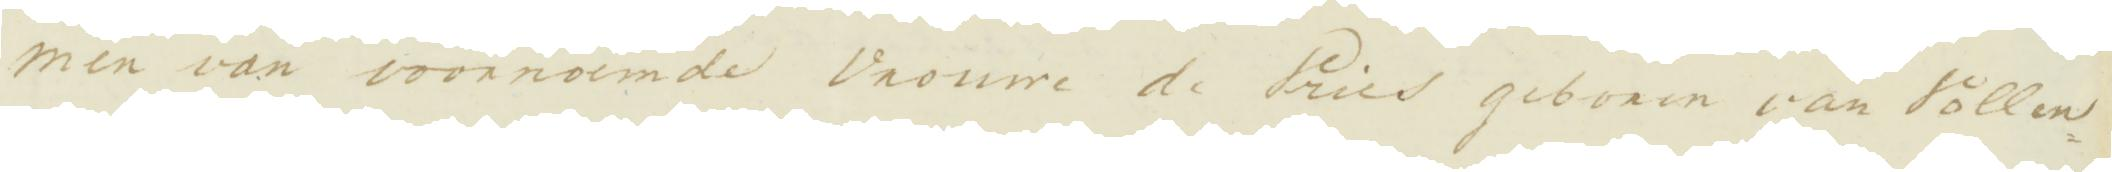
men van voornoemde Vrouwe de Vries geboren van Vollen=
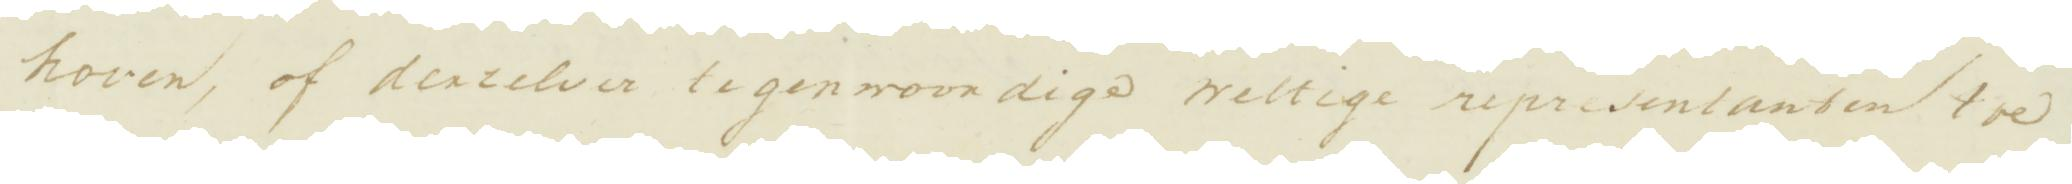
hoven, of derzelver tegenwoordige wettige representanten toe
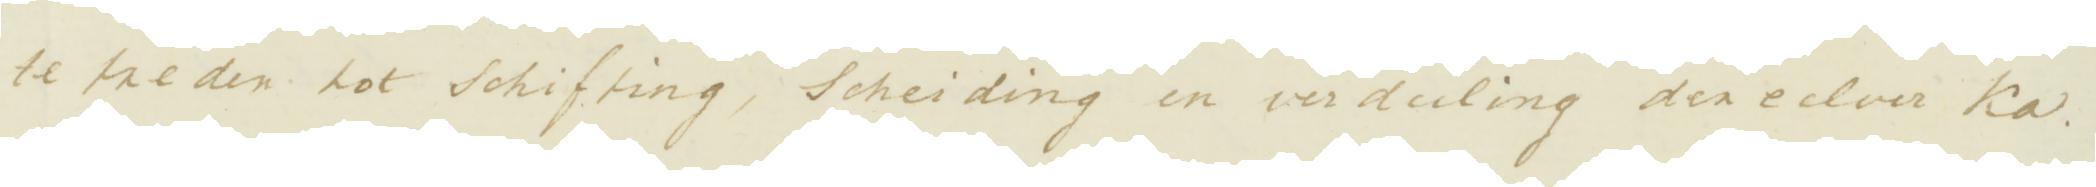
te treden tot schifting, scheiding en verdeeling der zelver Ka:
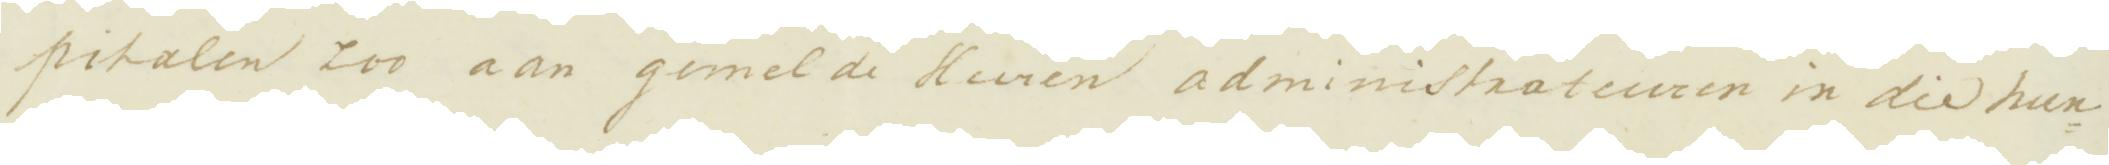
pitalen zoo aan gemelde Heeren administrateuren in die hun=
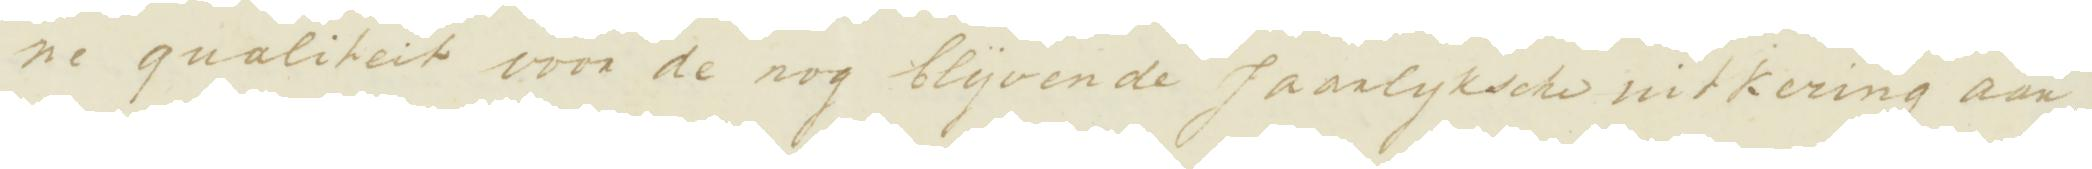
ne qualiteit voor de nog blijvende Jaarlijksche uitkering aan
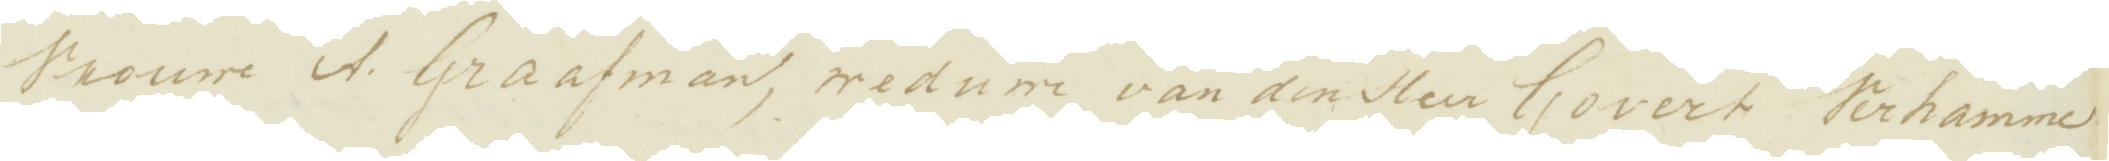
Vrouwe A. Graafman, weduwe van den Heer Govert Verhamme
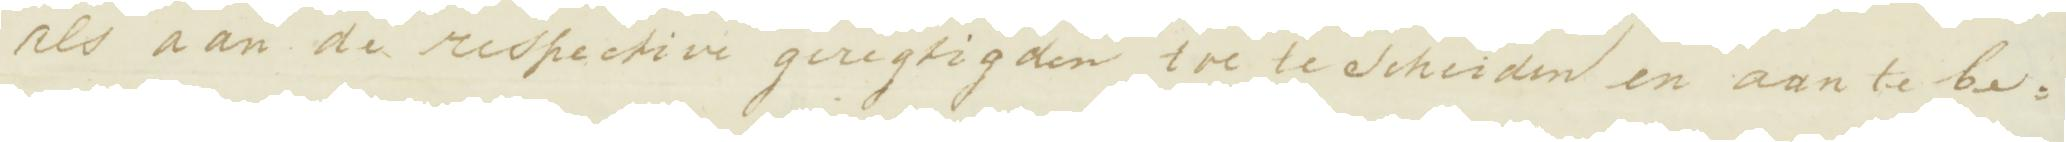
als aan de respective geregtigden toe te scheiden en aan te be=
